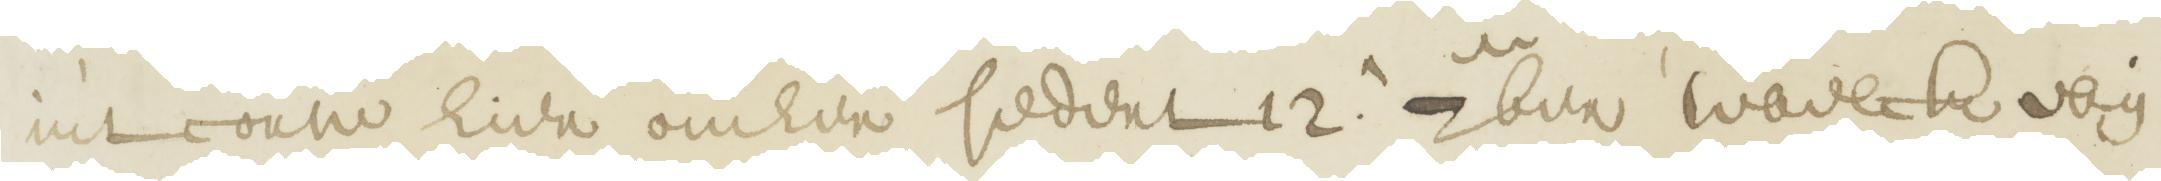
in 't corte hier om her sedert 12.' 7ber 't welck wij
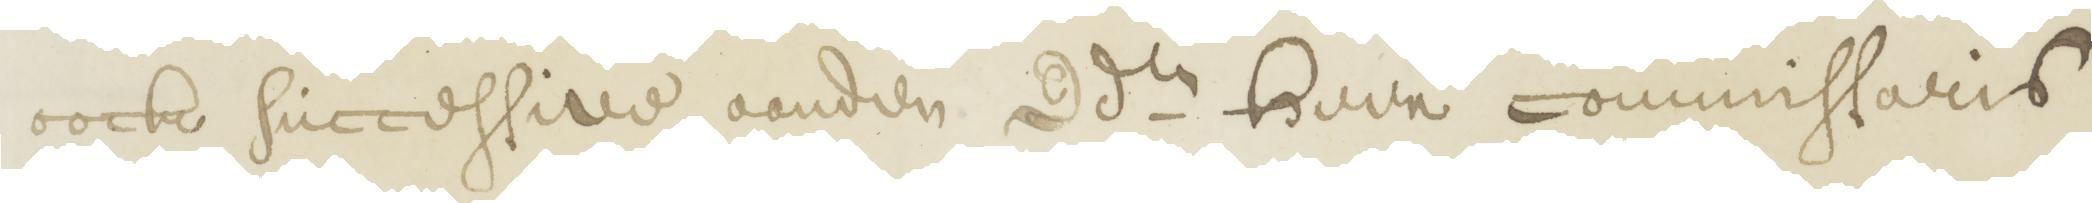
oock successive aanden Ed=le heer commissaris
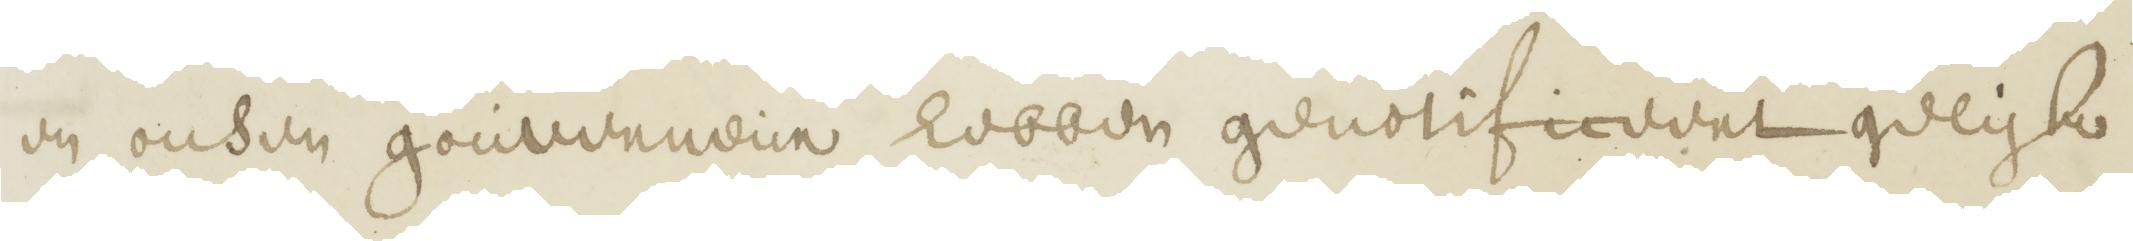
en onsen gouverneur hebben genotificeert gelijk
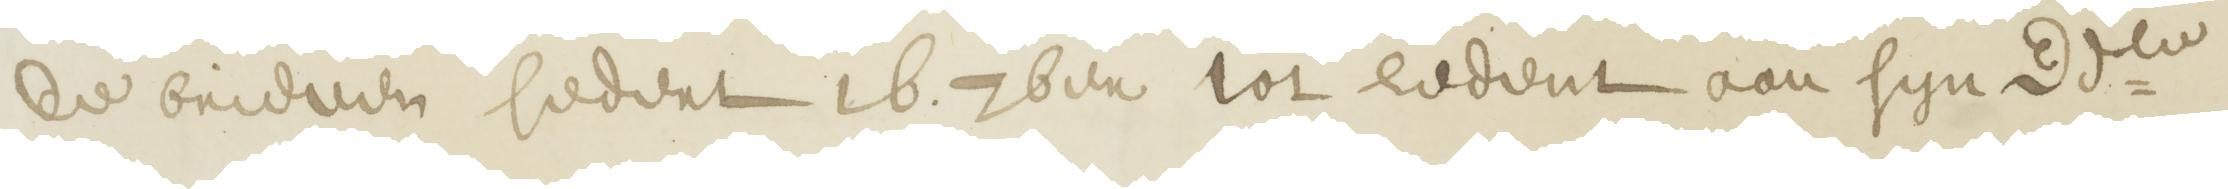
de brieven sedert 16. 7ber tot hedent aan syn Ed=le
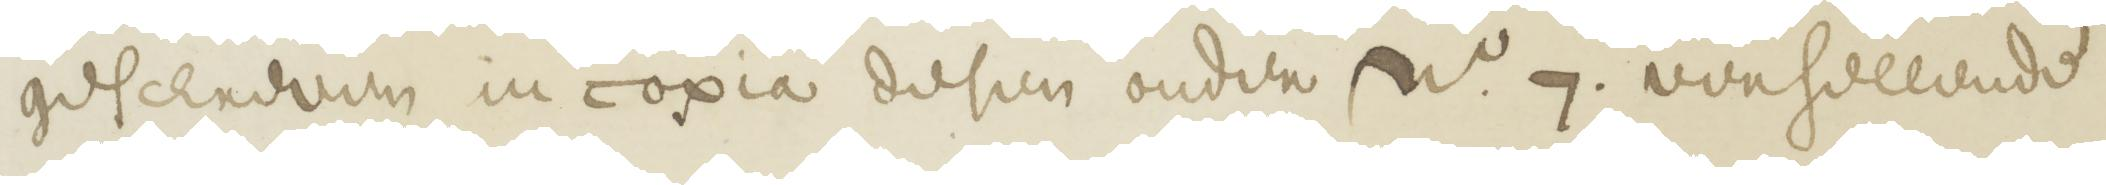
geschreven in copia desen onder n.o 7. versellende
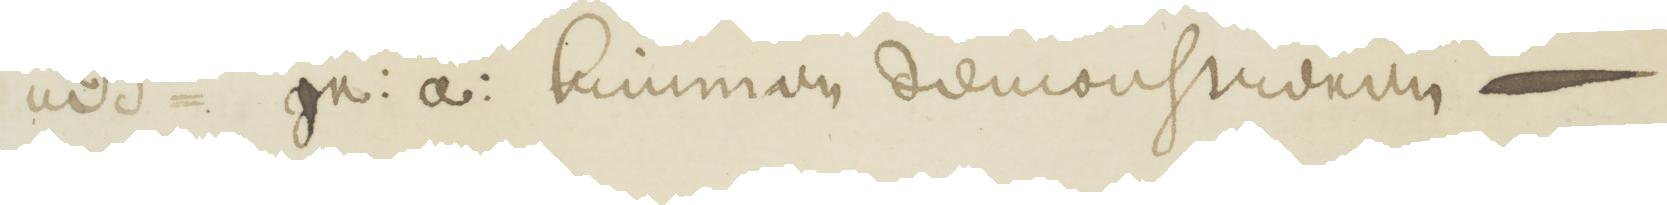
uEd=le gr: a: kunnen demonstreren -
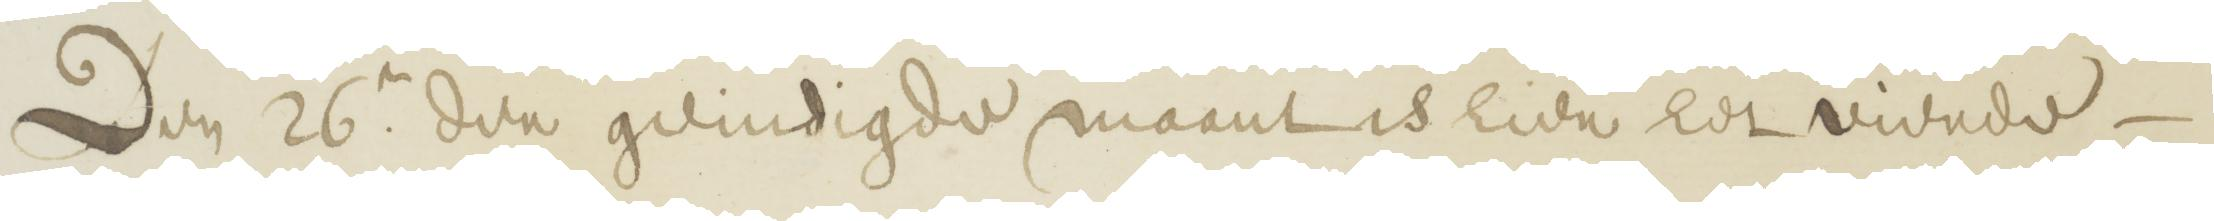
Den 26.' der geindigde maant is hier het vierde
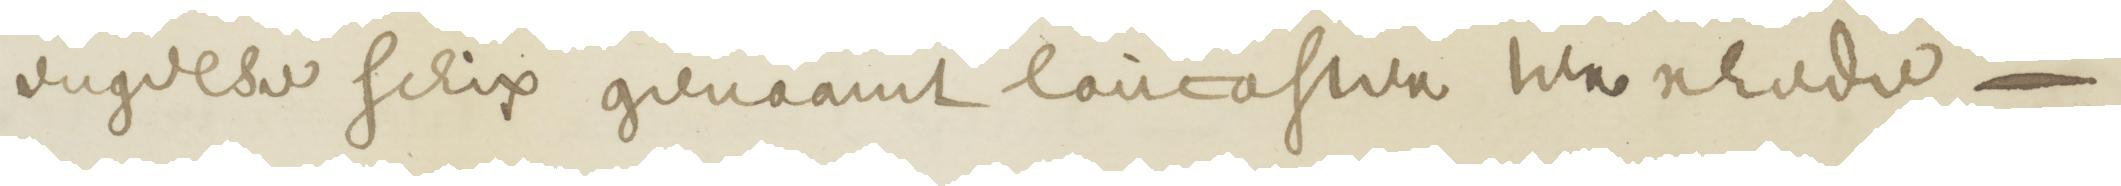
engelse schip genaamt laucaster ter rhede
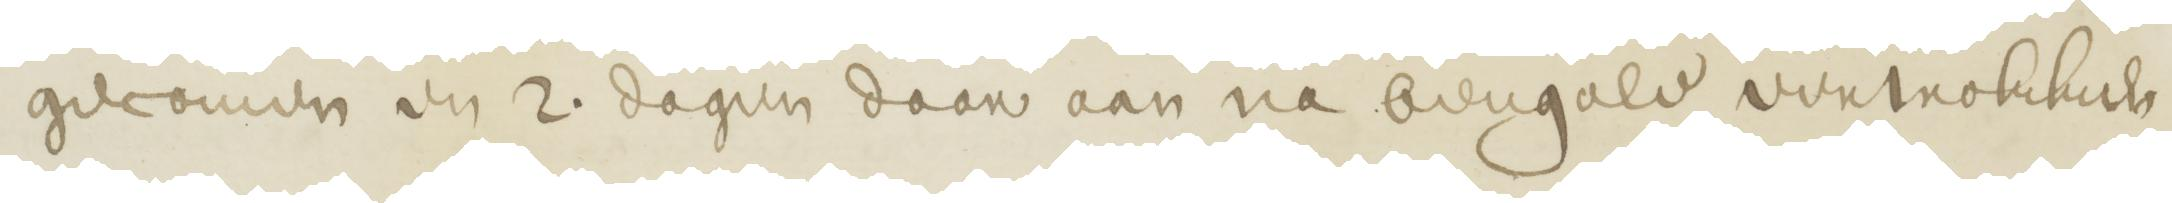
gecomen en 2. dagen daar aan na bengale vertrokken
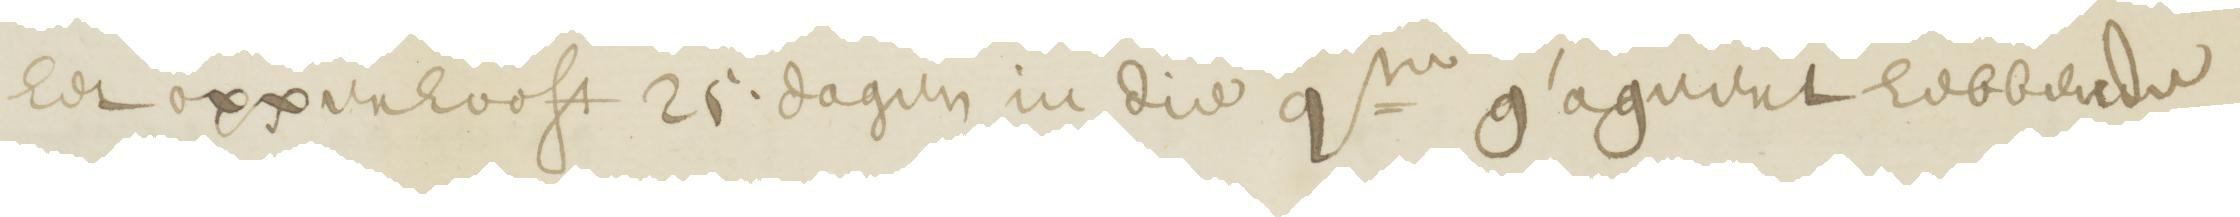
het opperhooft 25. dagen in die q=te g’ageert hebbende
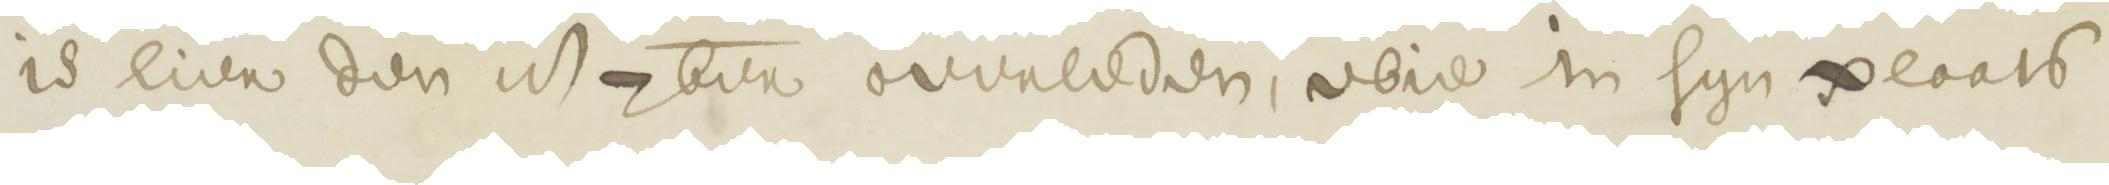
is hier den 18 7ber overleden, wie in syn plaats
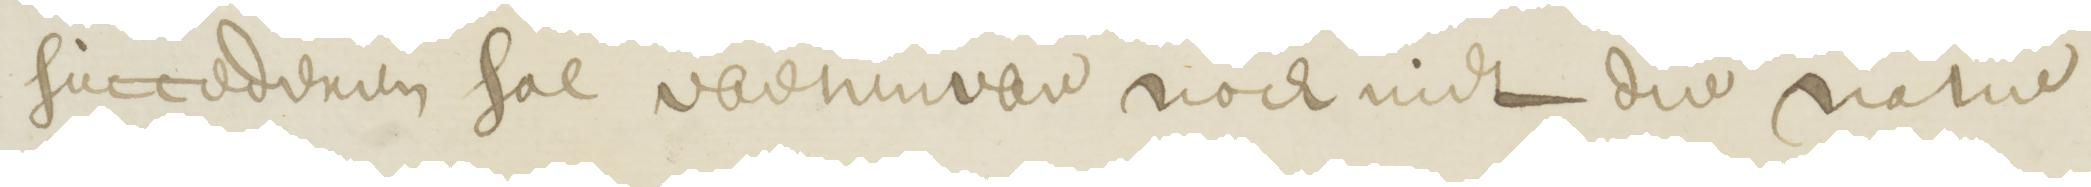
succederen Sal weten we noch niet die natie
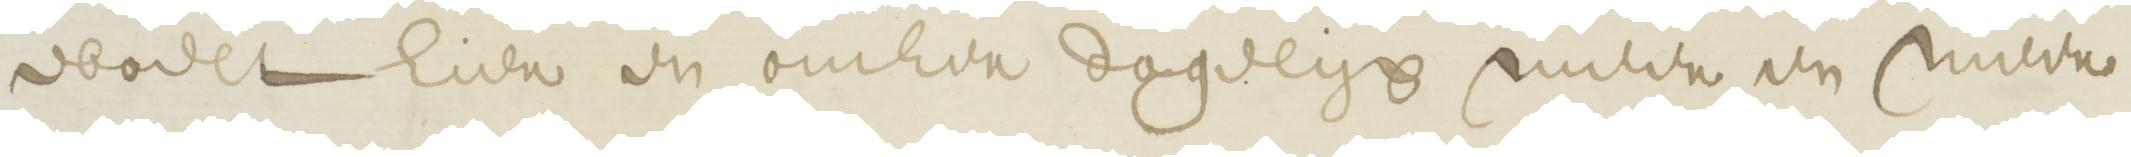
woelt hier en omher dagelijx meer en meer
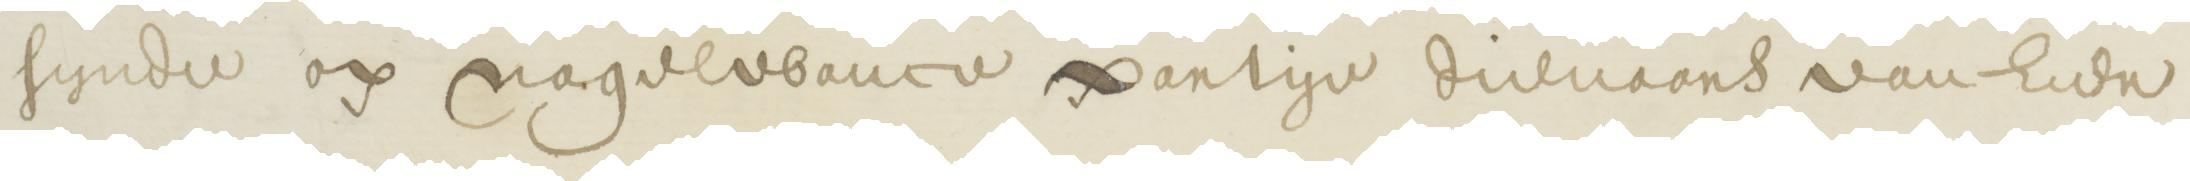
synde op nagelwance partije dienaars van hier
